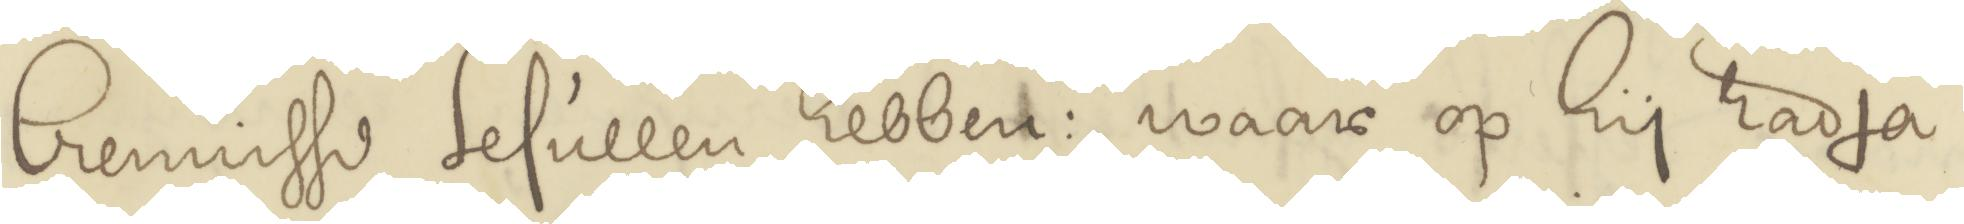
kennisse te sullen hebben: waar op hij radja
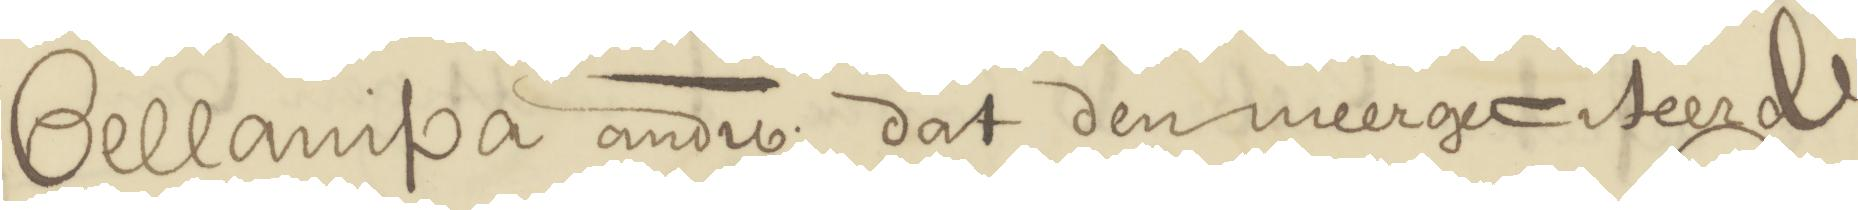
Bellanipa andw: dat den meergeciteerde
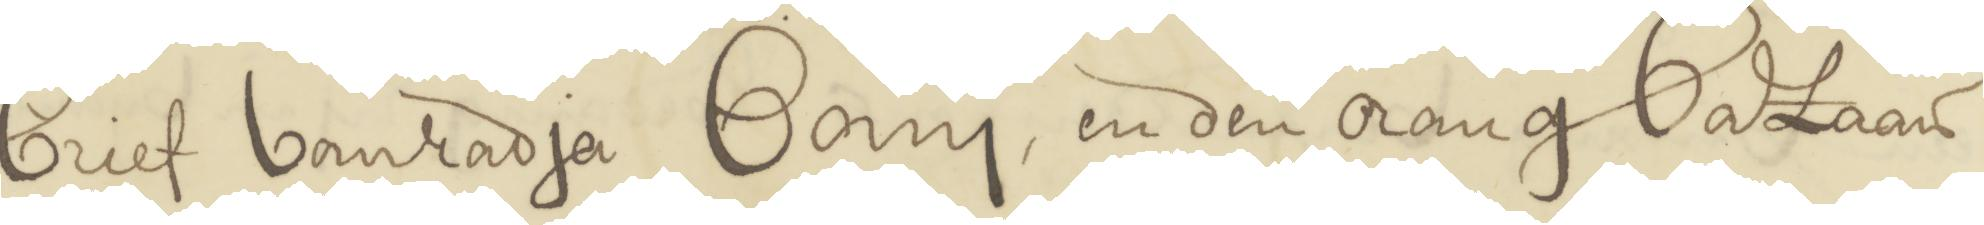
brief vanradja Bonij, en den orang Bazaar
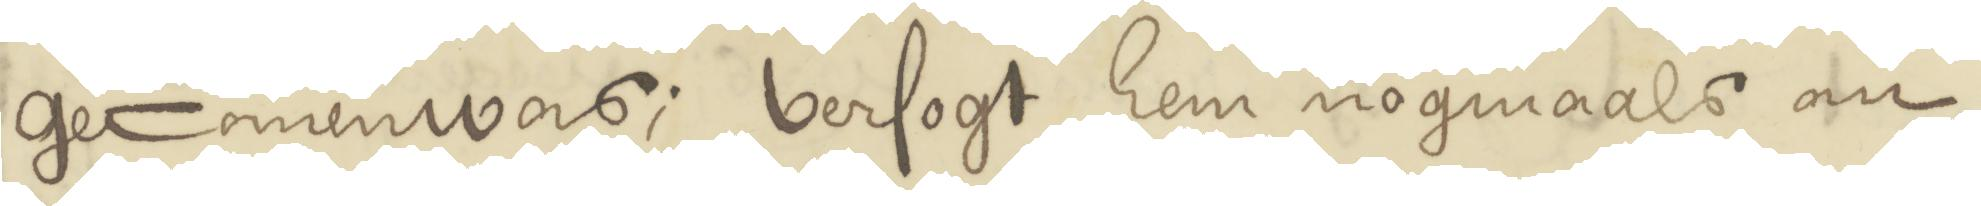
gecomenwas; versogt hem nogmaals om
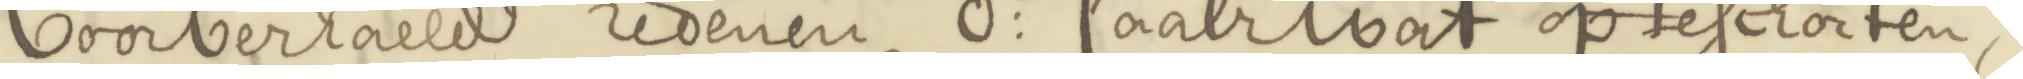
voorverhaelde redenen d:o saakwat op teschorten,
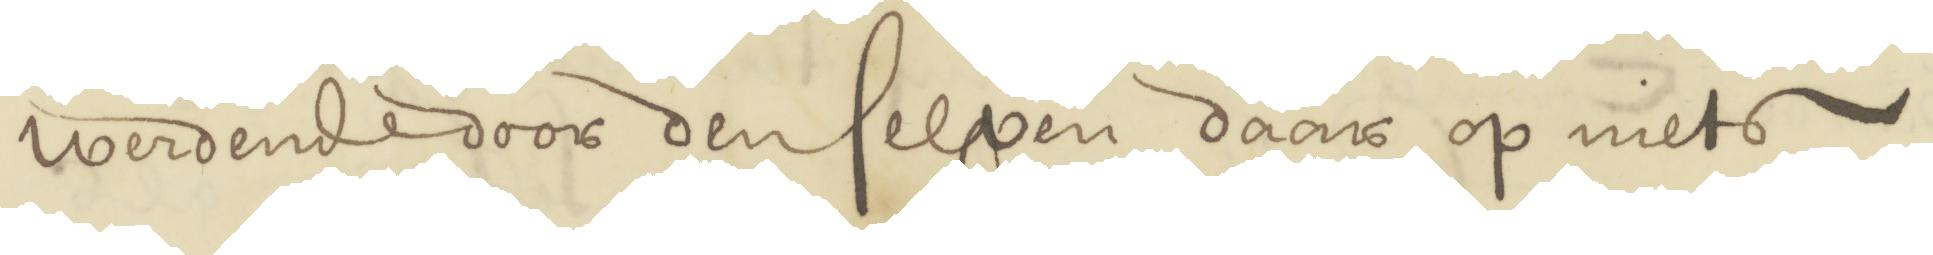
werdende door den selven daar op niets
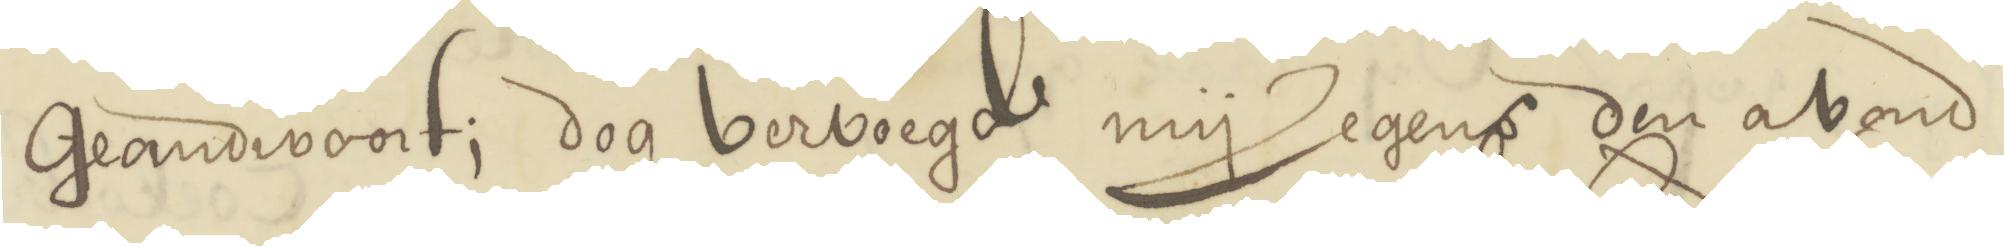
geandwoort; dog vervoegde mij Jegens den avond
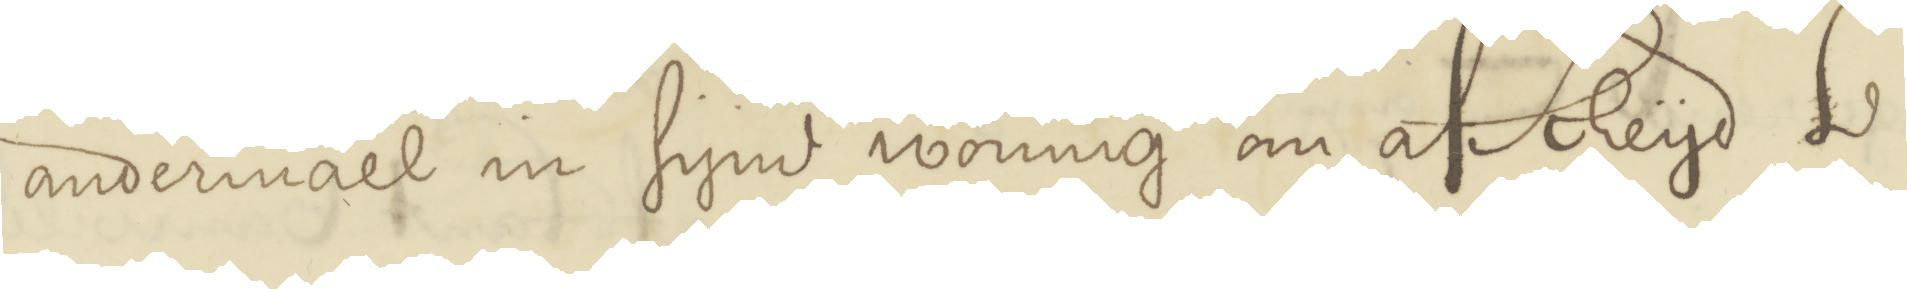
andermael in sijne woning om afscheijd te
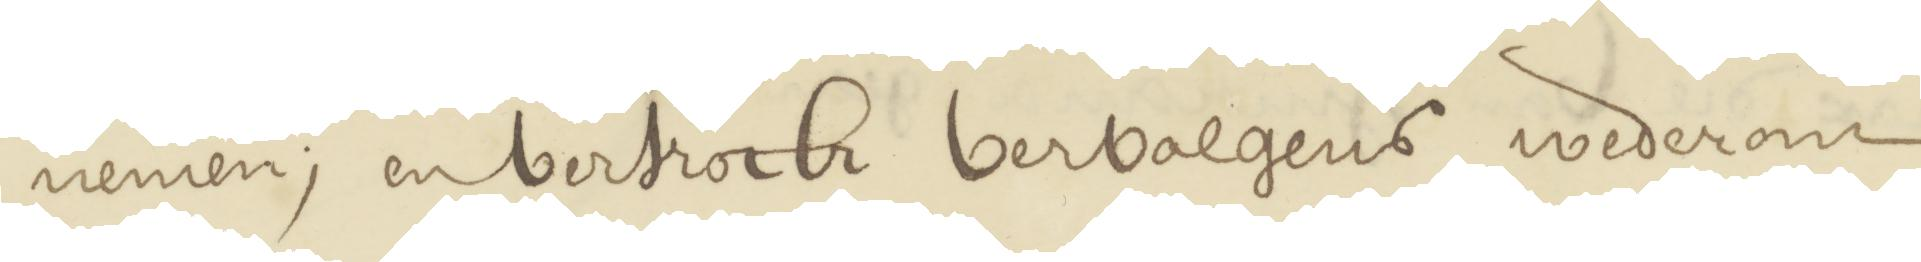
nemen; en vertrock vervolgens wederom
